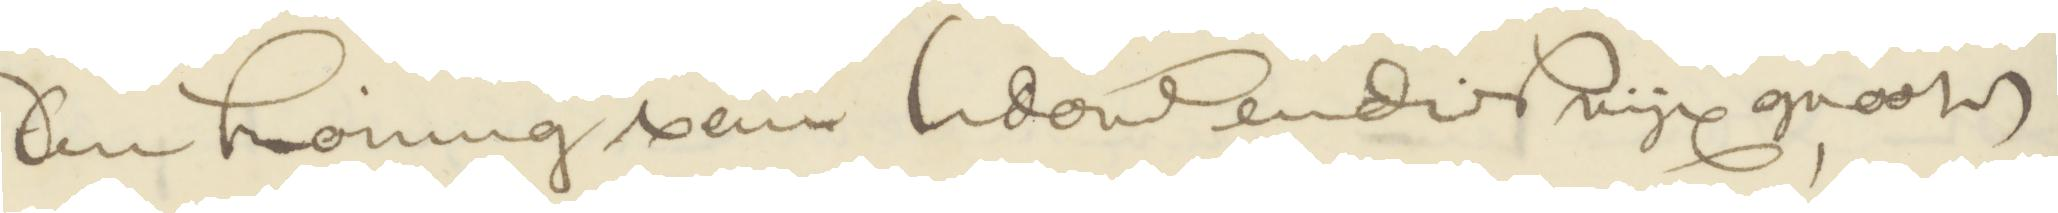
den koning van tidore en dies rijx grooten
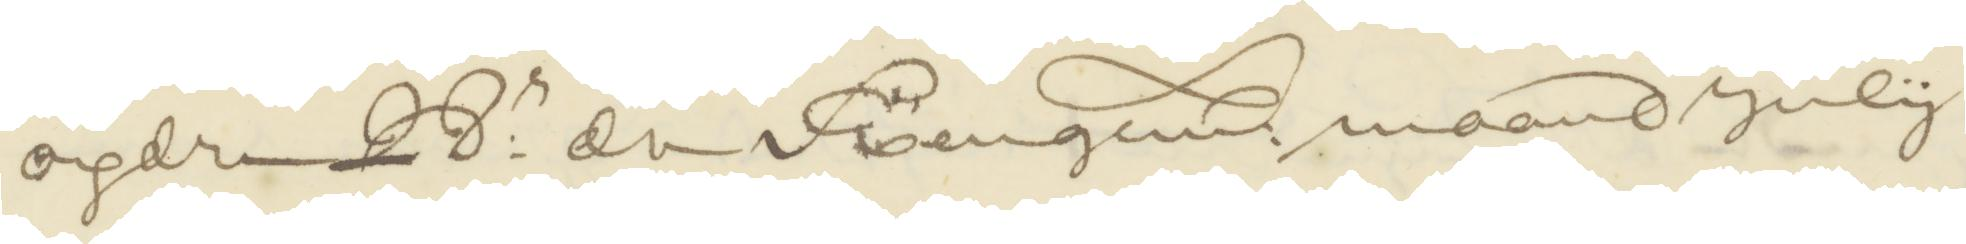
op den 28:en Evengem: maand Julij
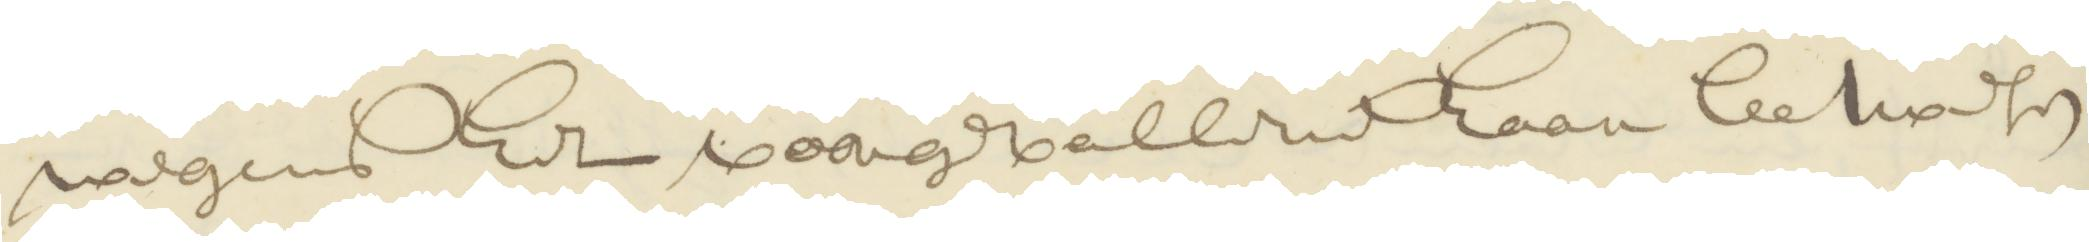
wegens het voor gevallene haar leetwesen
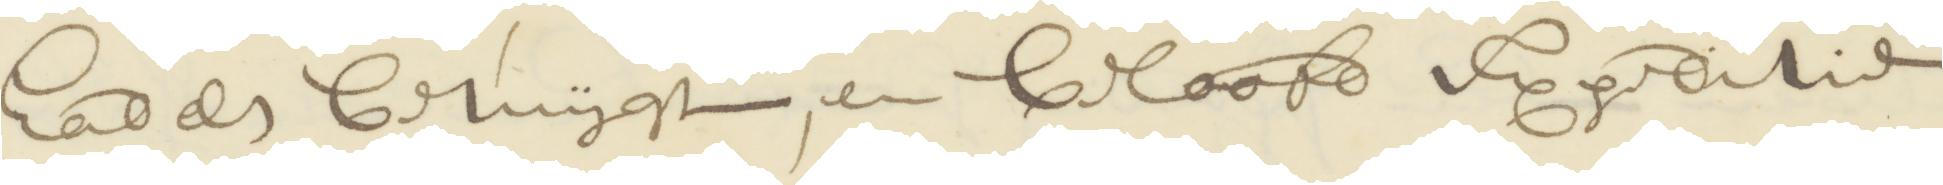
had den betuijgt, en beloofd Expeditie
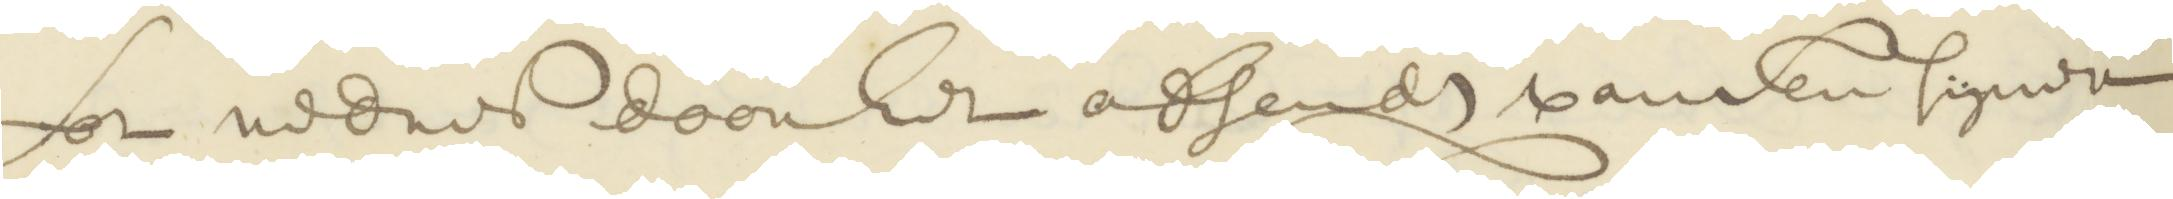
tot redres door het afsenden van Een sijner
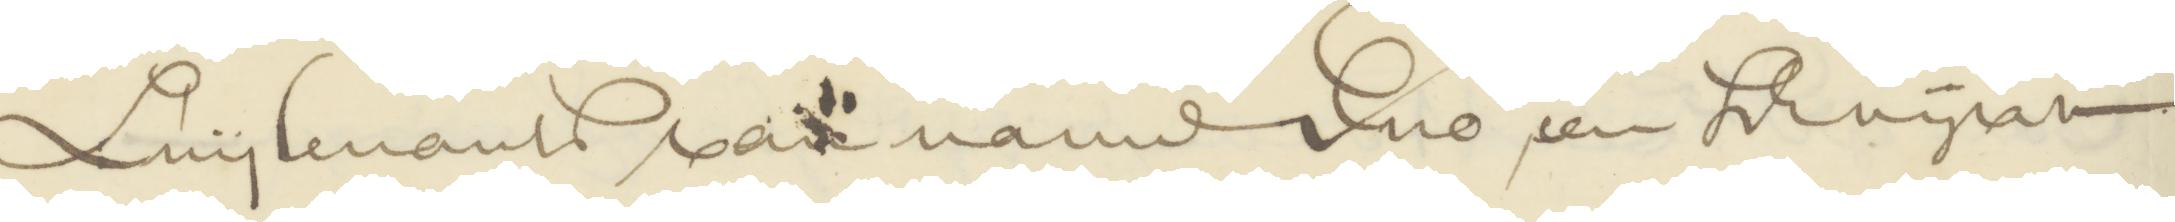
Luijtenants van name Eno, een schrijver
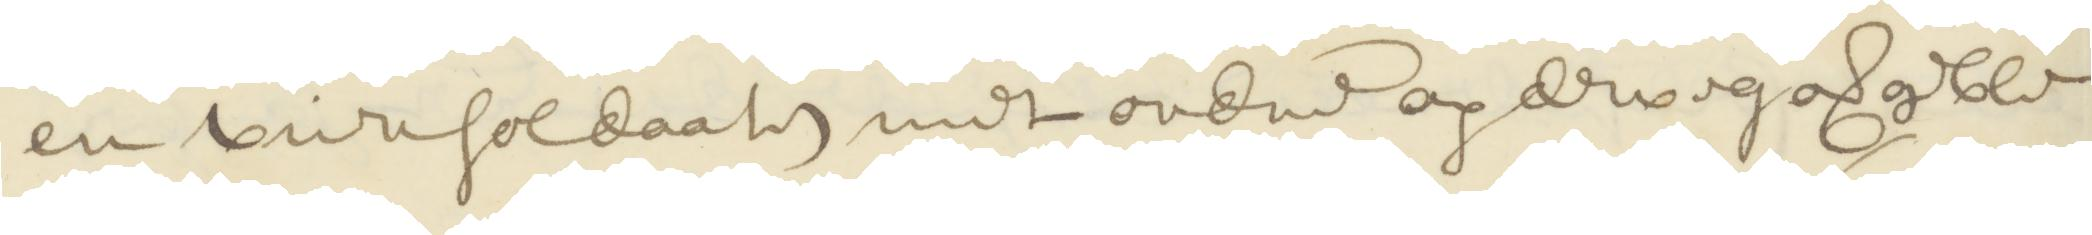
en vier soldaaten met ordre op de weg over geble
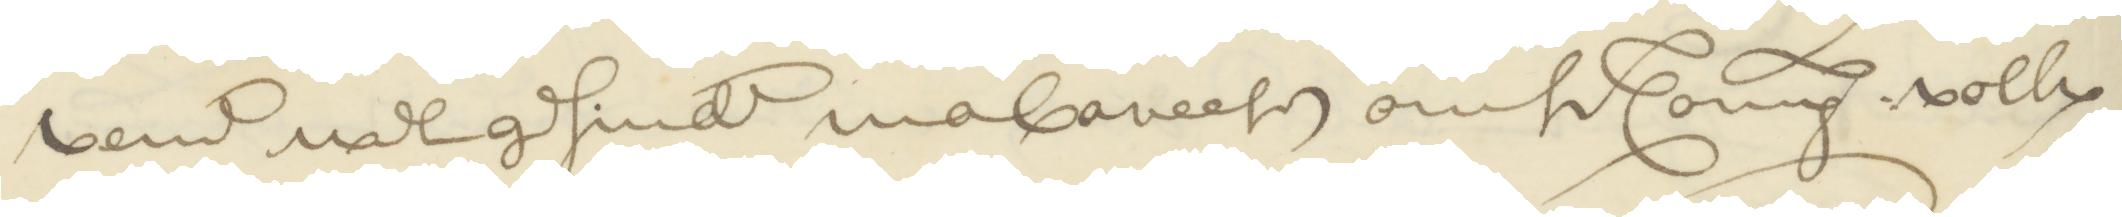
vene wel gesinde mabareesen om s E Comp: volk
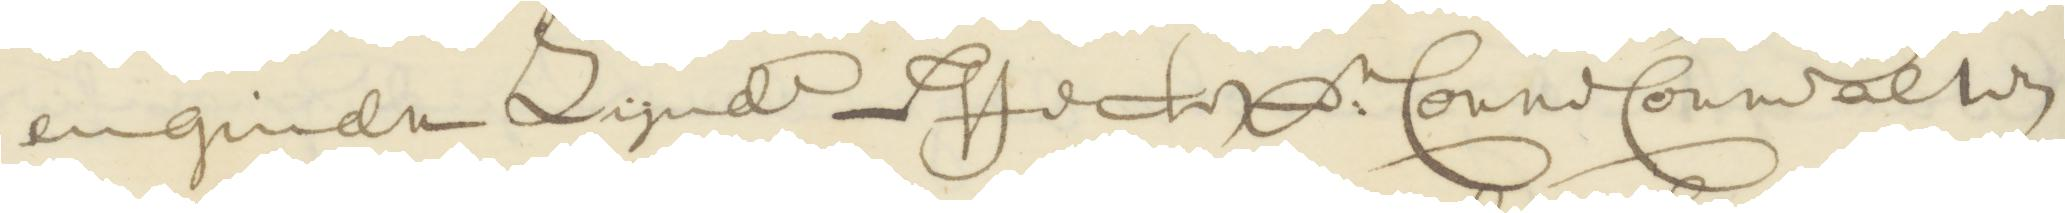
en ginder Zijnde Effecten p:r Corne Corne al ten
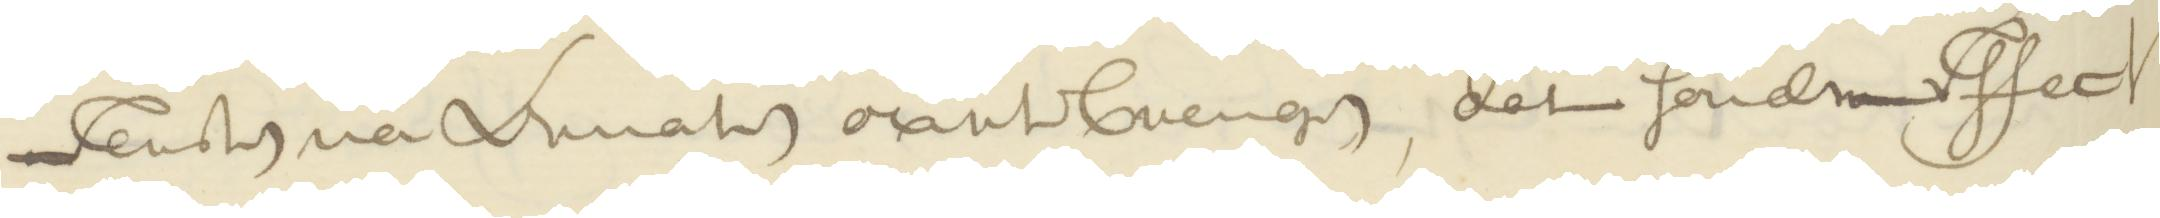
Eersten na Ternaten over te brengen, dat sonder Effect
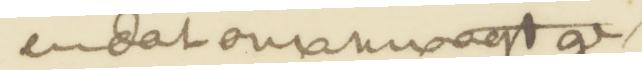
en dat onver wagt ge
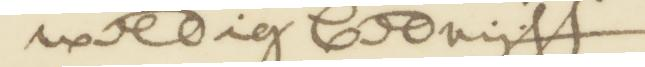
weldig bedrijfs
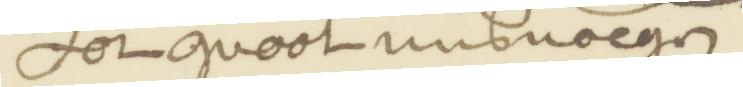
tot groot misnoegen
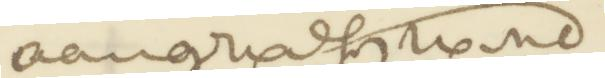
aangewesen werd
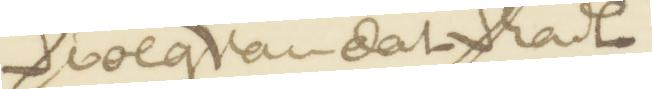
vervolg van dat verhael
